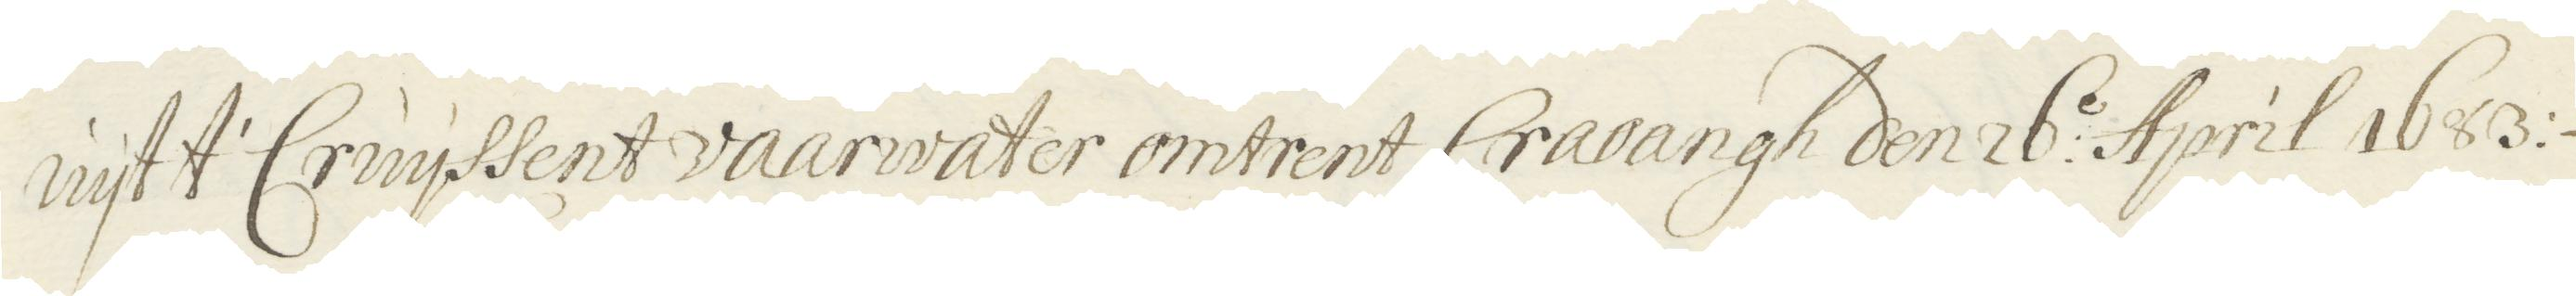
uijt ’t Cruijssent vaarwater omtrent Cravangh den 26:e April 1683:
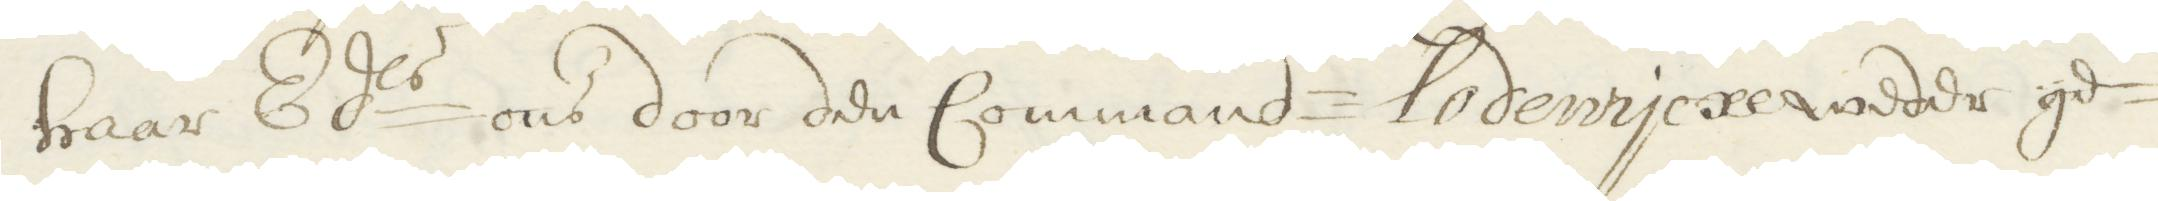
haar Ed=s ons door den Command=r lodewijcxe weder ge=
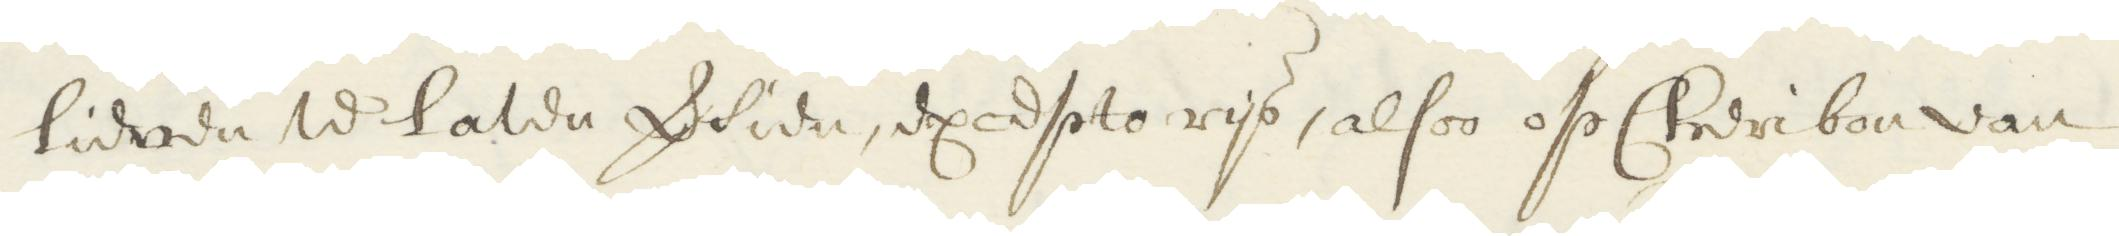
lieven te laten versien, exceptorijs, alsoo op cheribon van
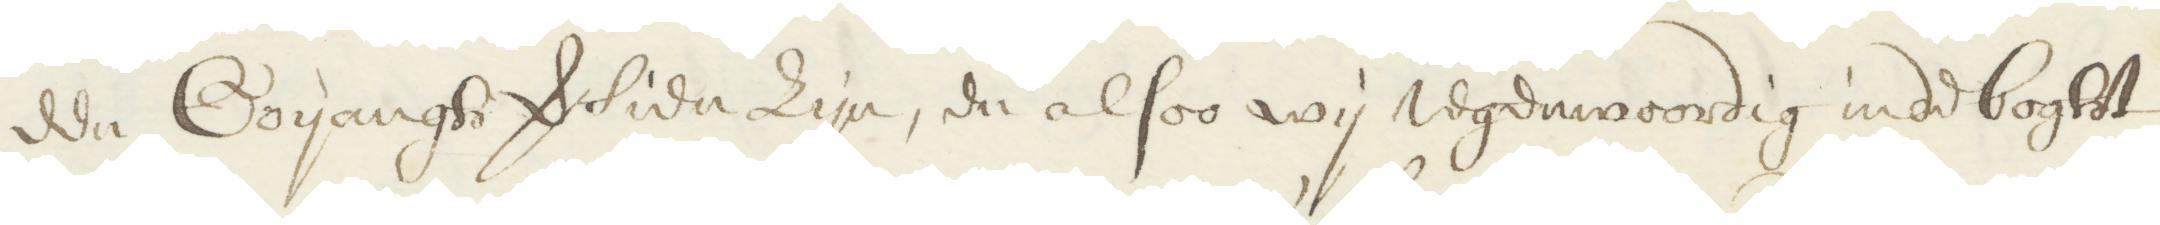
een Coijangh versien zijn, en alsoo wij tegenwoordig in de boght
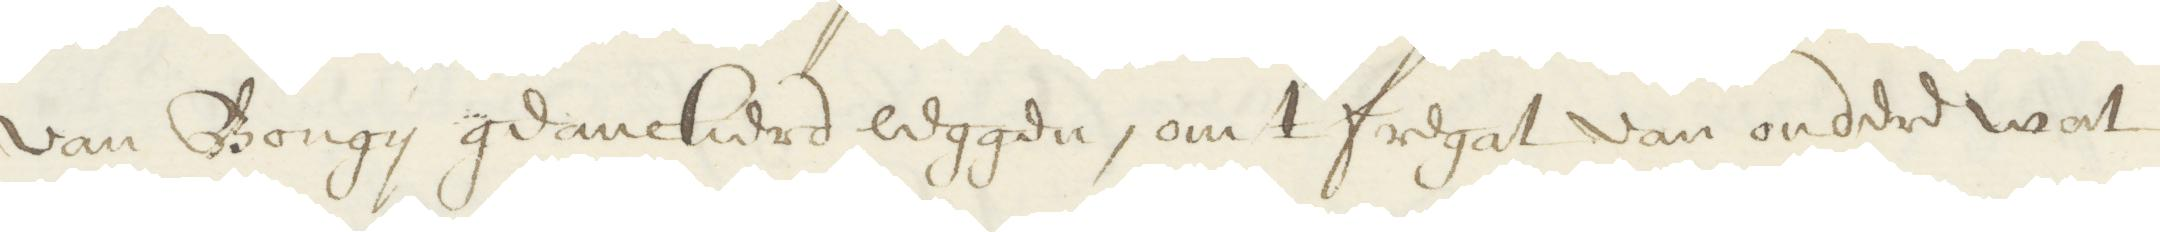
van Bongy geanckerd leggen, om t fregat van ondere wat
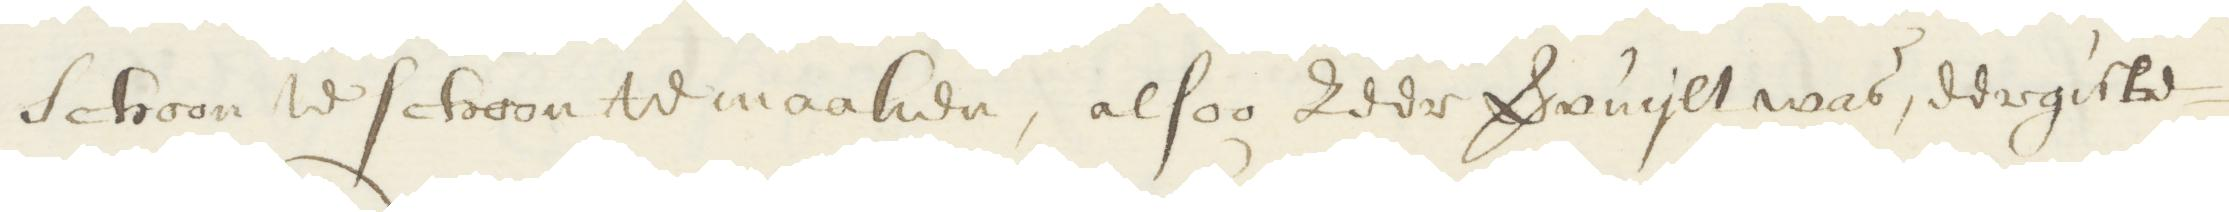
schoon te schoon te maaken, alsoo zeer vervuijlt was, eergiste
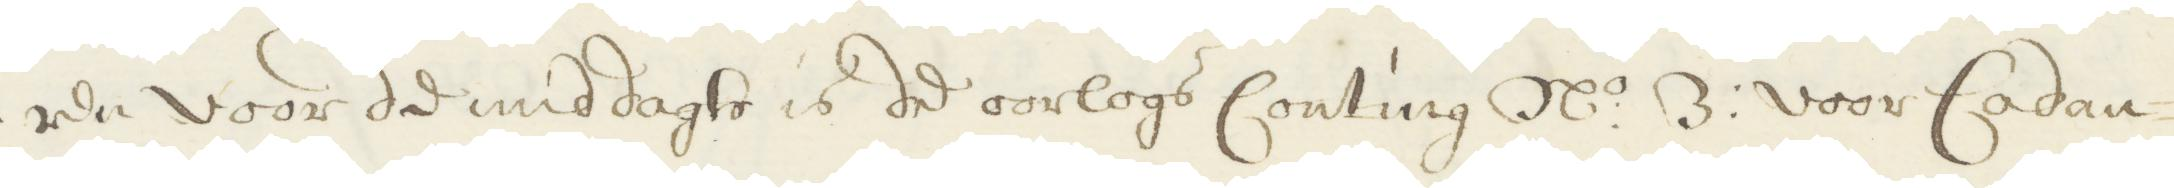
ren voor de middagh is de oorlogs conting N:o 3: voor cadan-
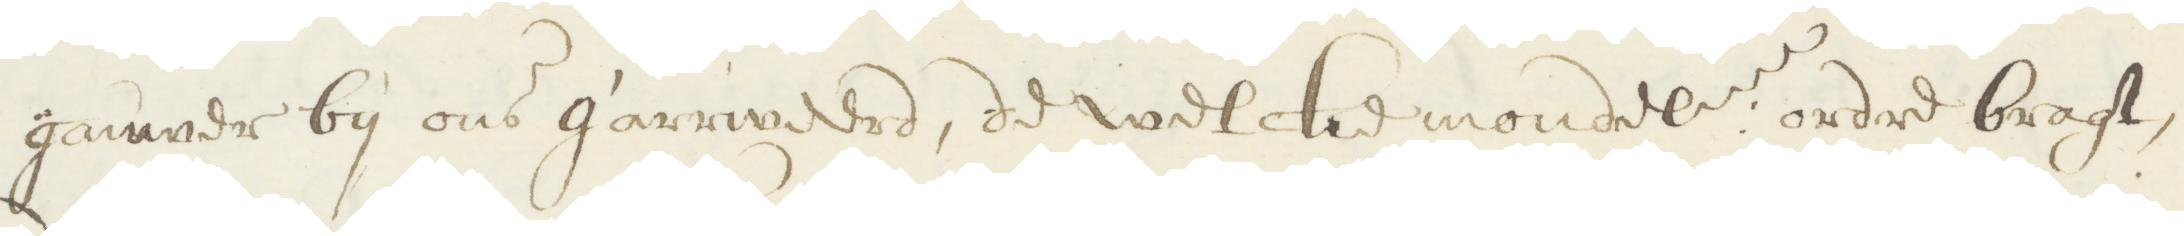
gauner bij ons g’arriveerd, de welcke mondel: ordre bragt,
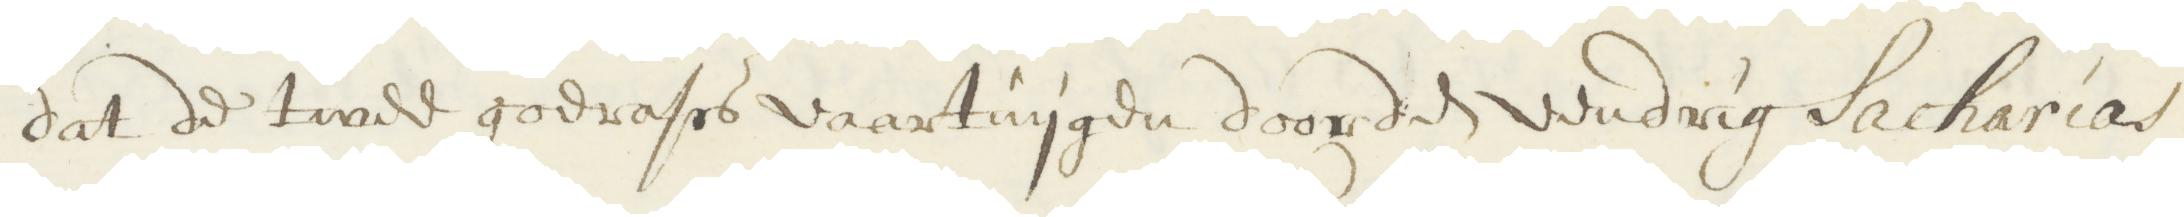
dat de twee goeraps vaartuijgen door den vendrig Sacharias
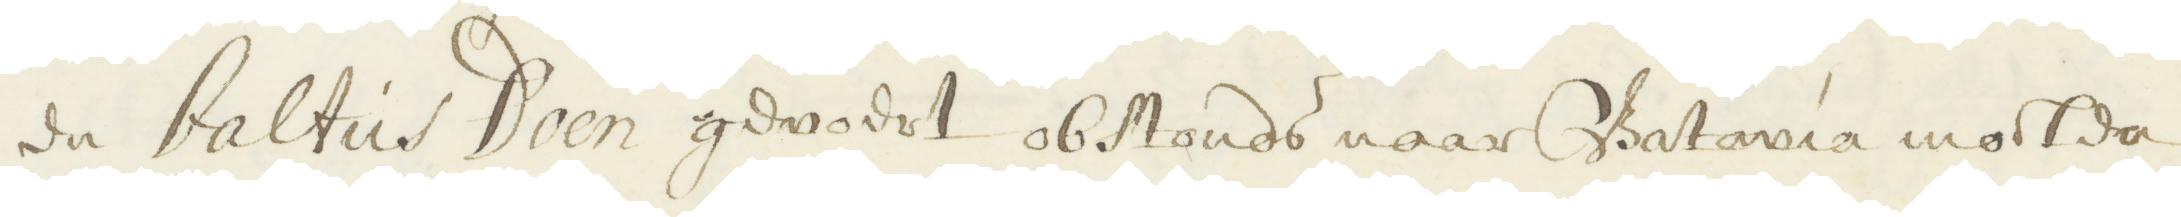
en baltus Doen gevoert obstonds naar Batavia mosten
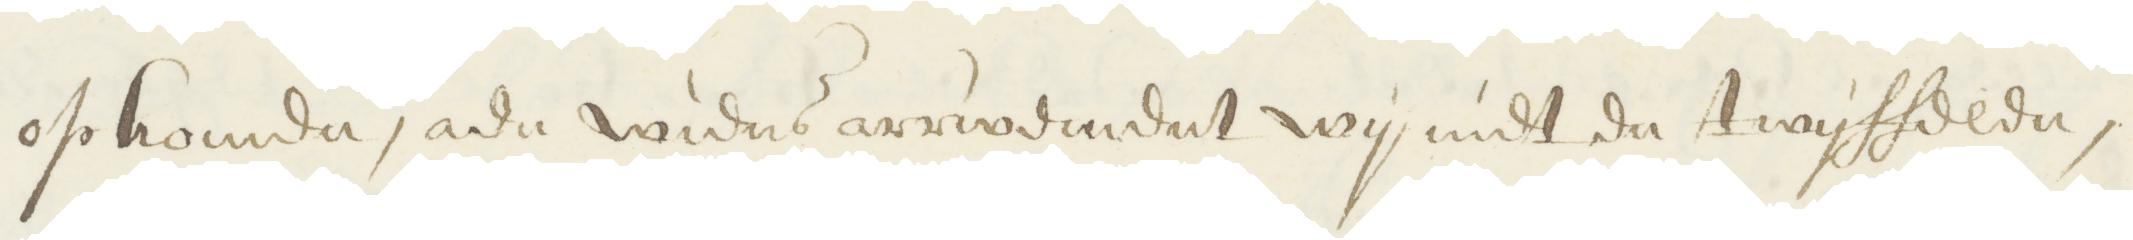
op komen, aen wiens arrivement wij niet en twijffelen,
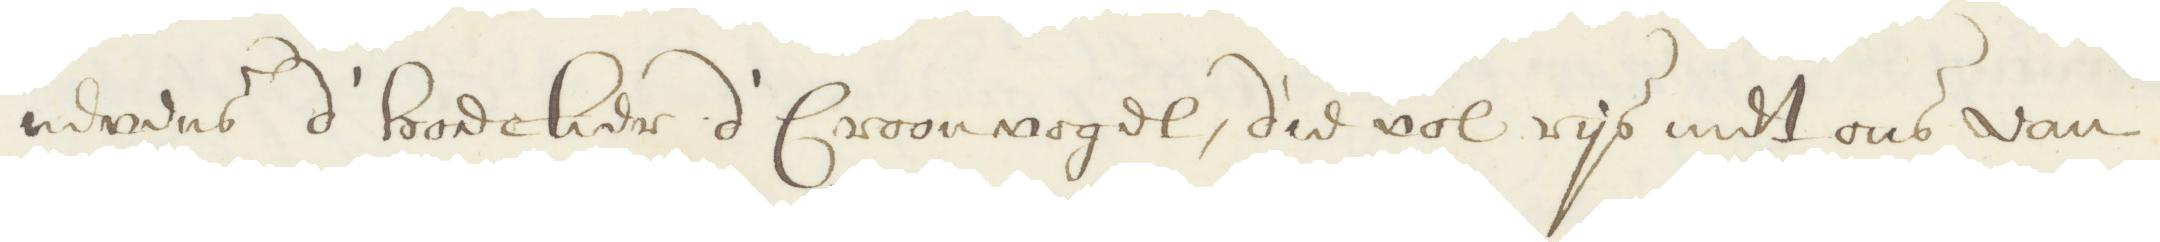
nevens d’ hoecker d’ Croonvogel, die vol rijs met ons van
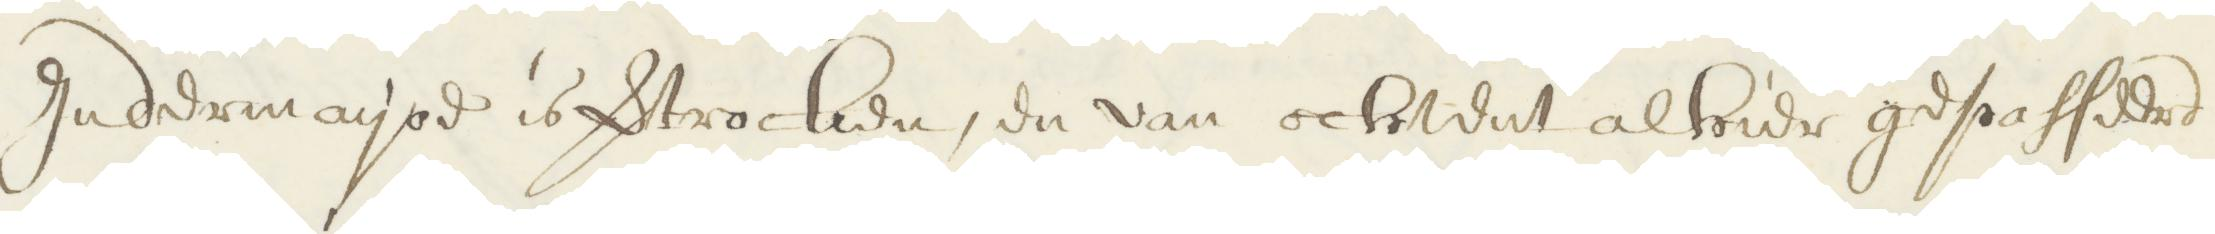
Indermaijse is vertrocken, en van ochtent alhier gepasseerd
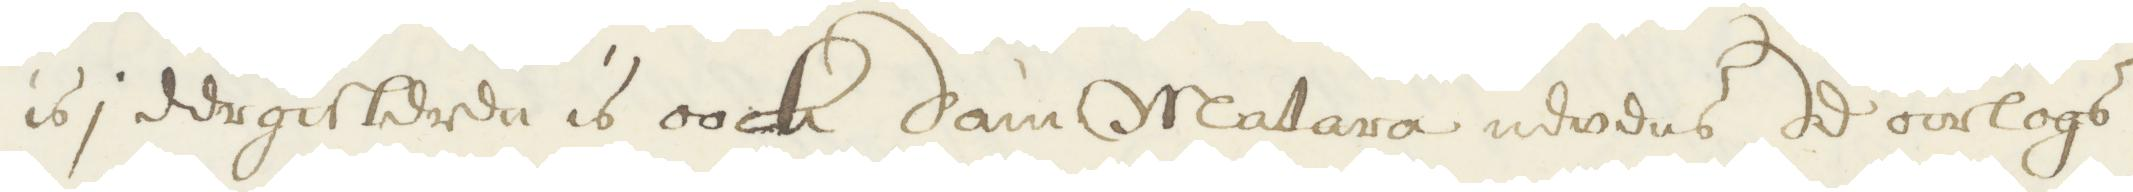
is; eergisteren is oock dain Matara nevens de oorlogs
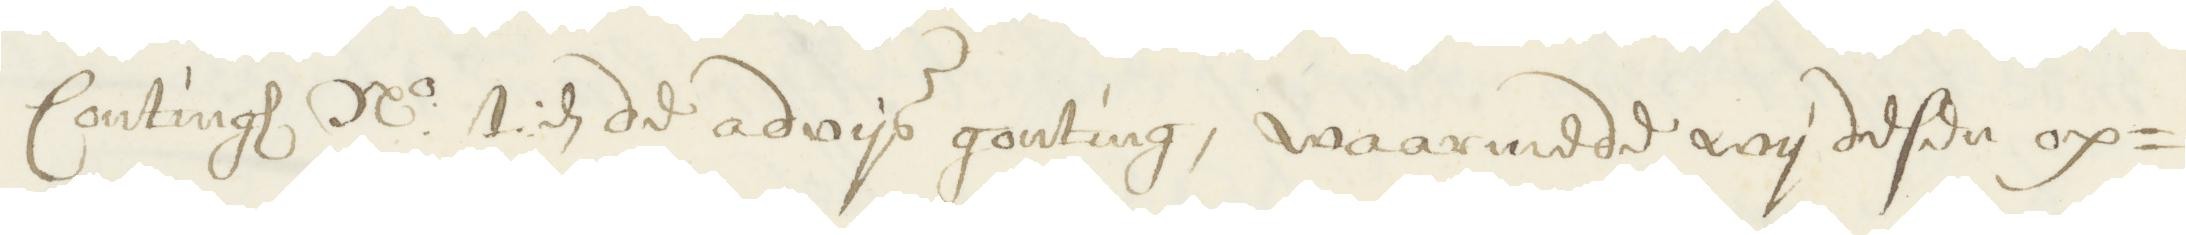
contingh N:o 1:en de advijs gonting, waarmede wij desen op=
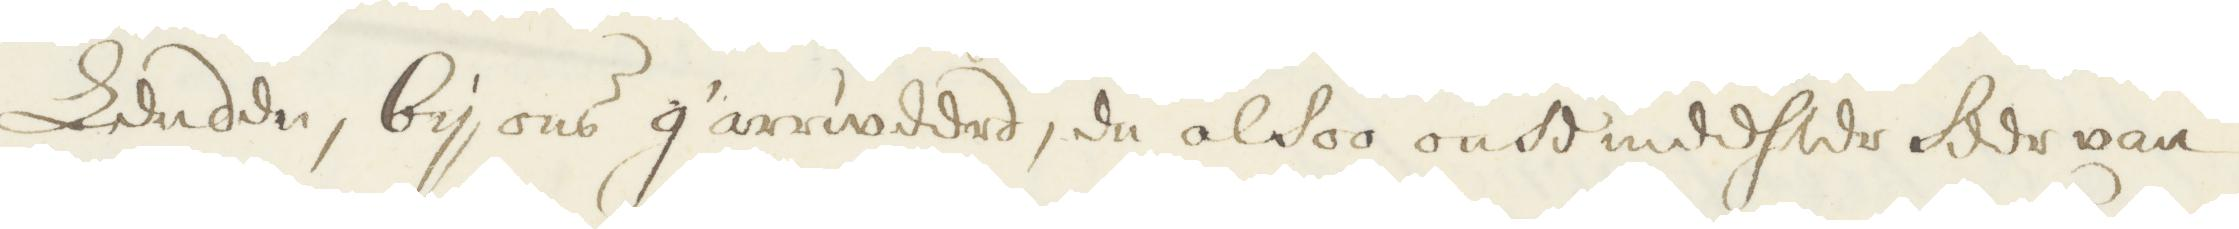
zenden, bij ons g’arriveerd, en alsoo onse meester seer van
